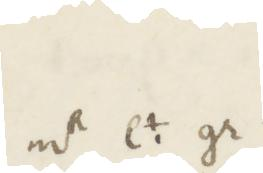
mk l.t gr
